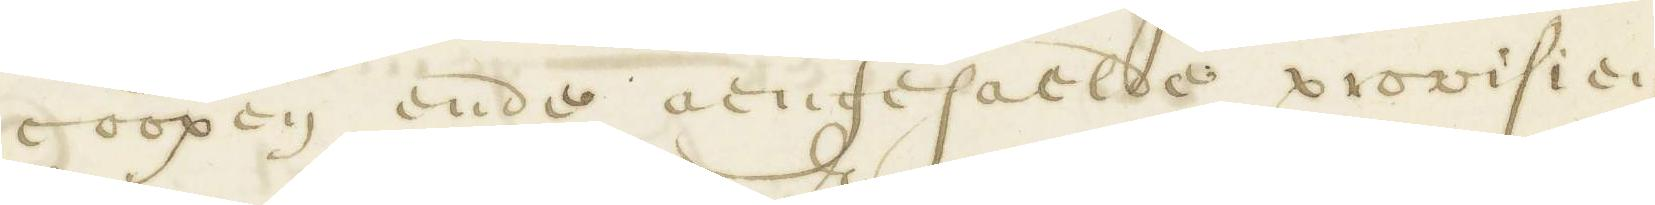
coopen ende aengehaelde provisien,
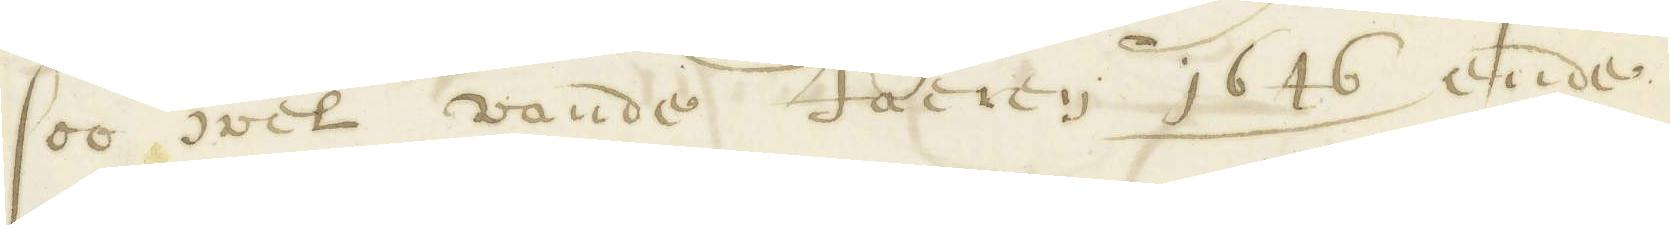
soo wel vande Iaeren 1646 ende
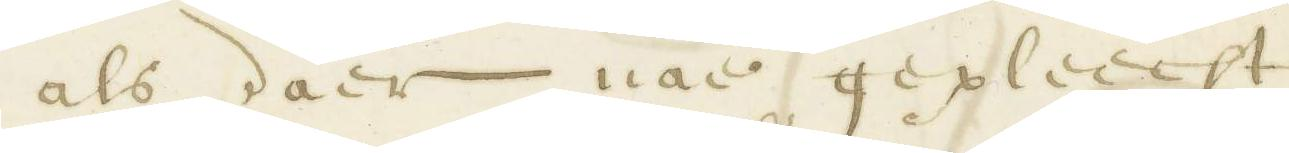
1647 als daer nae gepleecht
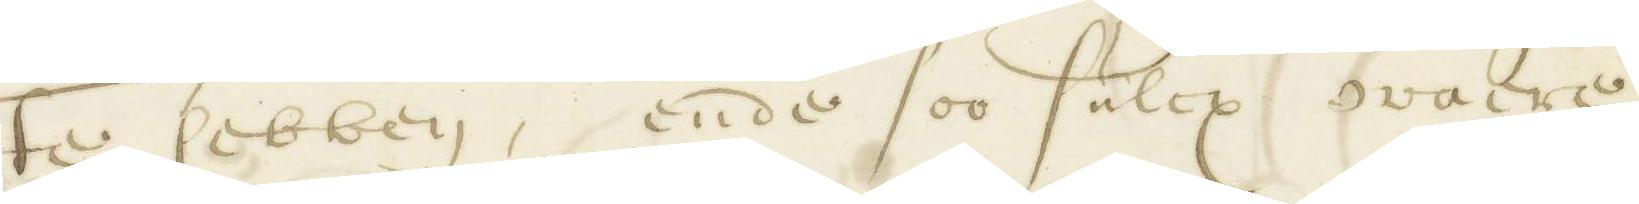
te hebben, ende soo sulcx waere
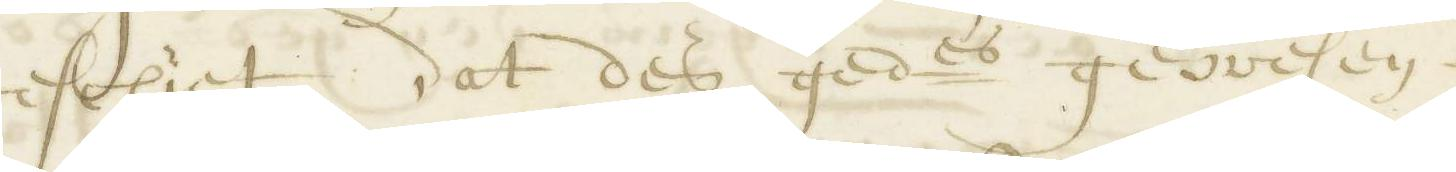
geschict, dat des ged=es gewesen
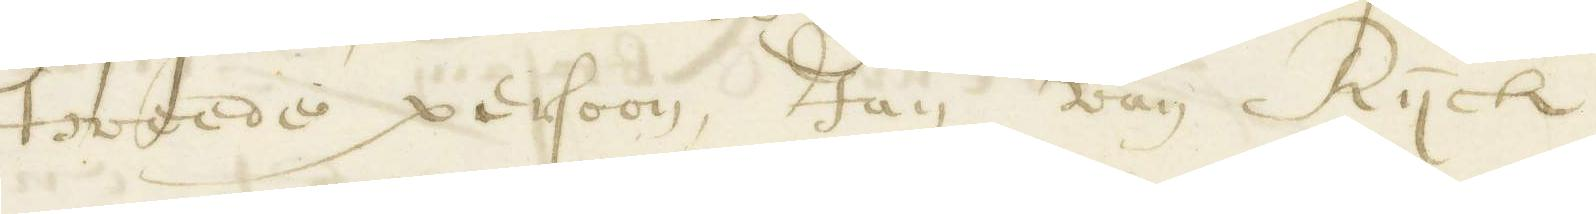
tweede persoon, Ian van Rijck
